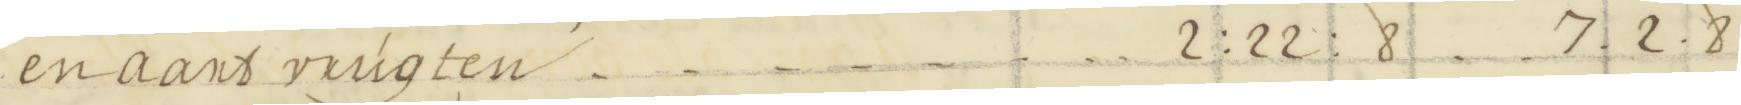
en aart vrugten - - - - - . . . 2: 22: 8 . . 7: 2. 8
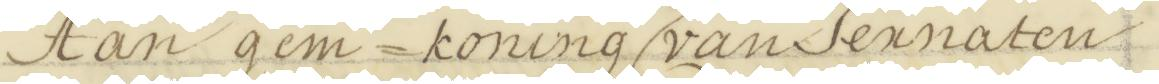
Aan gem=e koning van Ternaten
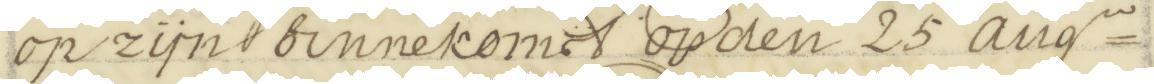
op zijn binnekomst op den 25e aug=o
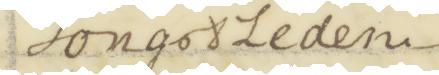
Iongst Leden
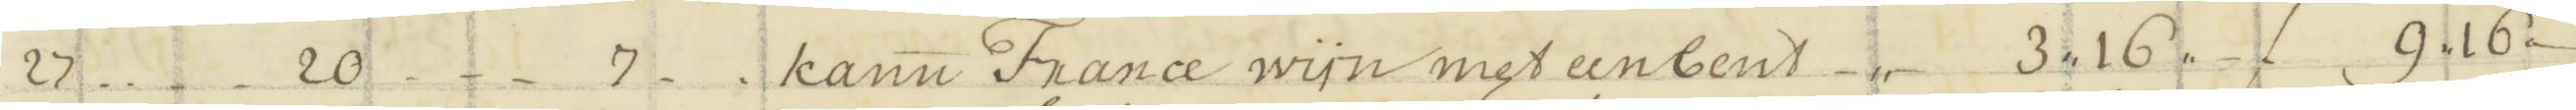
27 . . - - 20 - - - 7 - . kann France wijn met een bent - „ - 3 „ 16„ - ƒ 9„16„—
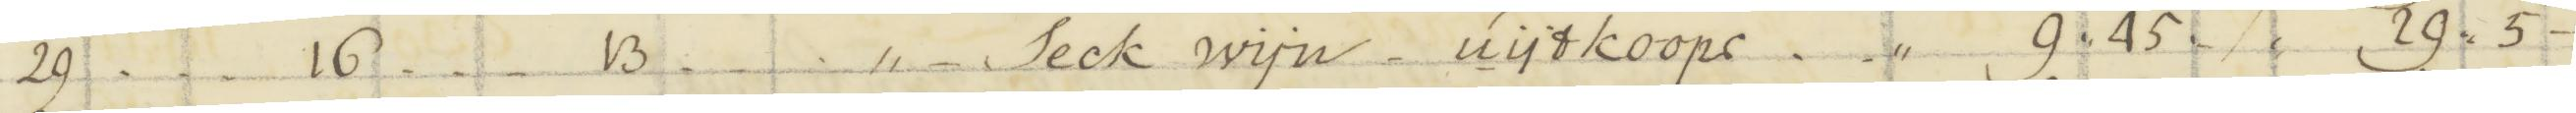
29 - - - 16 - - - 13 - - . „ - Seck wijn - uijtkoops - - „ 9„45„ - „ 29„ 5 —
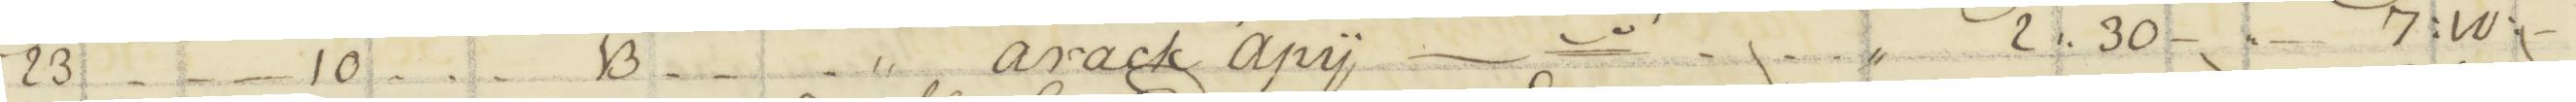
23 - - - 10 . . . 13 - - - „ arack apij _=o - - . „ 2„ 30 - „ — 7:10:—
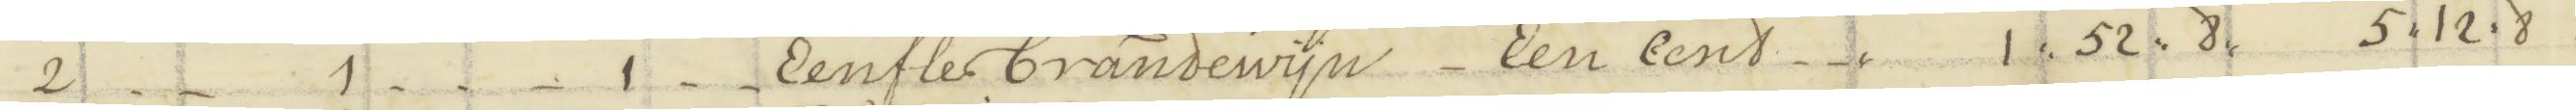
2 - - 1 - - - 1 - - Een fles brandewijn - Een cent - - „ 1 „ 52 „ 8 „ 5 „ 12 „ 8
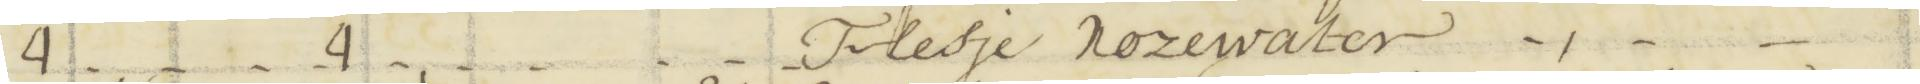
4 - - - - 4 - - - - - - Flesje rozewater - , - -
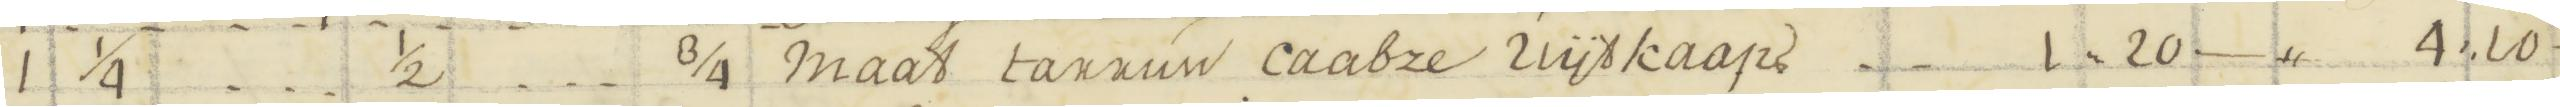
1¼ - - - ½ - - - ¾ maat tarruw caabze uijtkaaps - - 1„ 20—„ 4„10
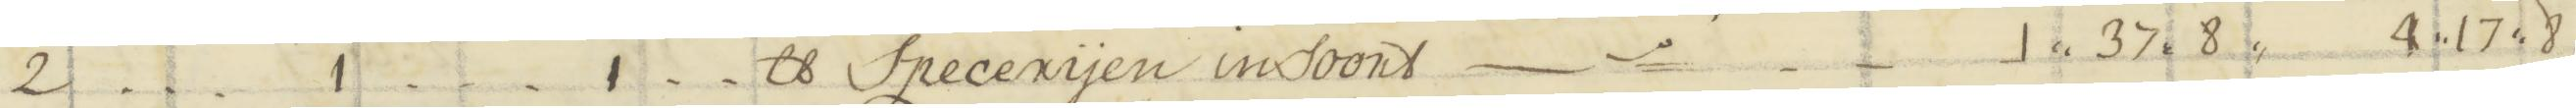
2 . . . 1 - - - 1 - - lb Specerijen in soort _=o - - - 1 „ 37 „ 8 „ 4„17„8
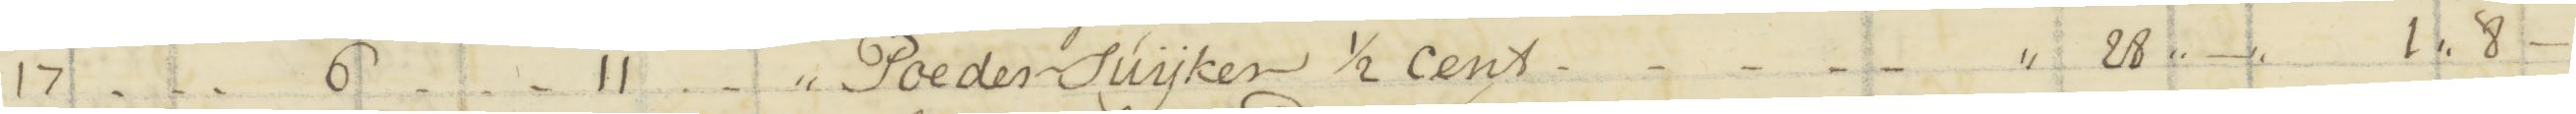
17 - - - 6 - - - 11 - - „ Poeder suijker ½ cent - - - - - „ 28 „—„ 1„ 8 —
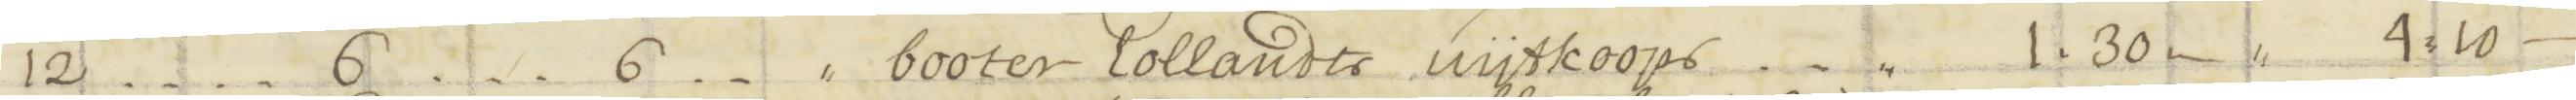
12 - - - - 6 - - - 6 - - „ booter hollandts uijtkoops . - „ 1:30 — „ 4 „10 —
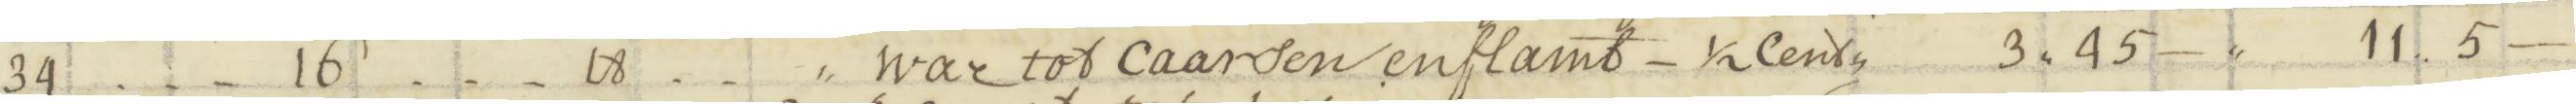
34 - - - 16 - - - 18 - - „ war tot Caarsen en flamd - ½ Cent„ 3 „ 45 — „ 11„5 —
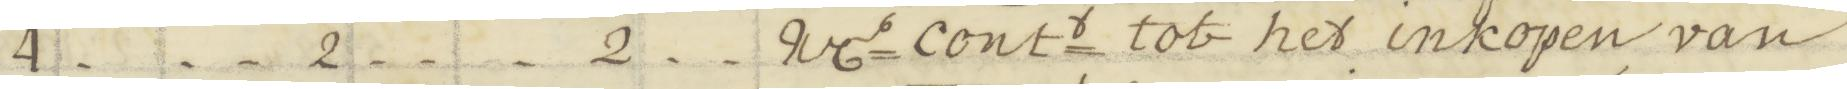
4 - - - 2 - - - 2 - - rx=s cont=s tot het inkopen van
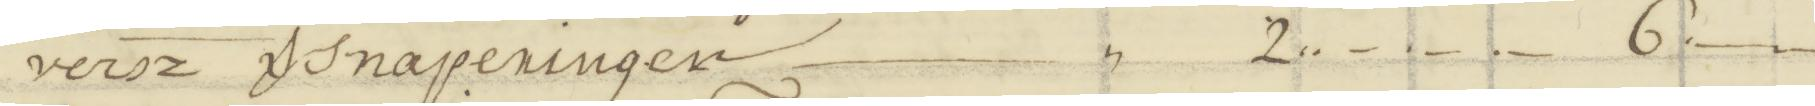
versz versnaperingen — „ 2„ — . — 6.—
